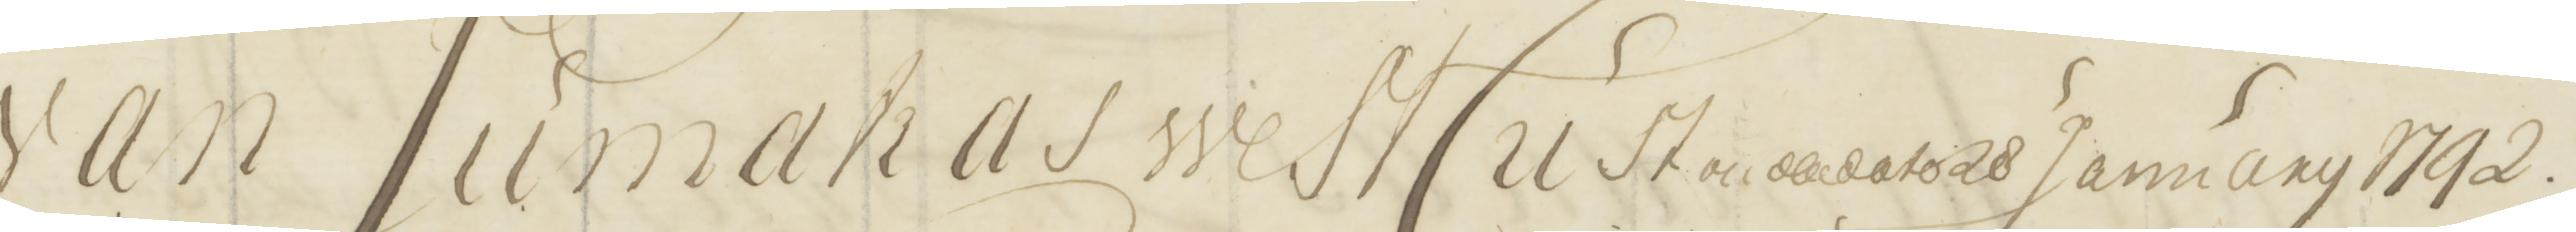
van Sumatras west Cust onder dato 28' January 1742.
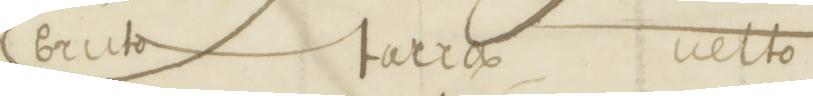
bruto tarra netto
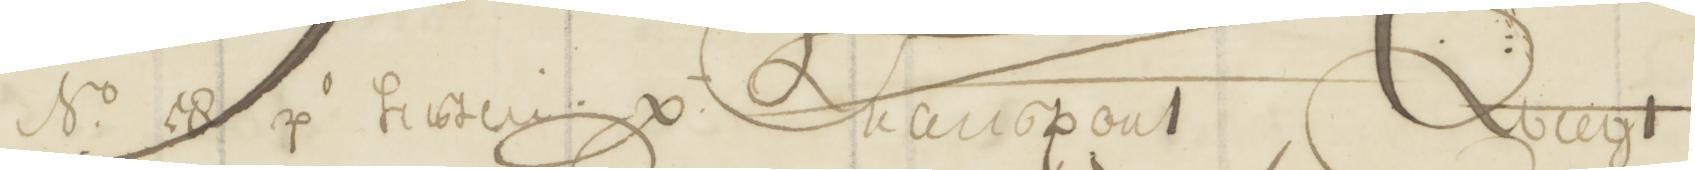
N:o 58. po kisten. p' Transport weegt
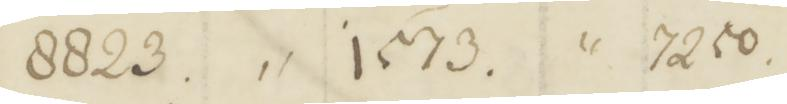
8823. „ 1573. „ 7250.
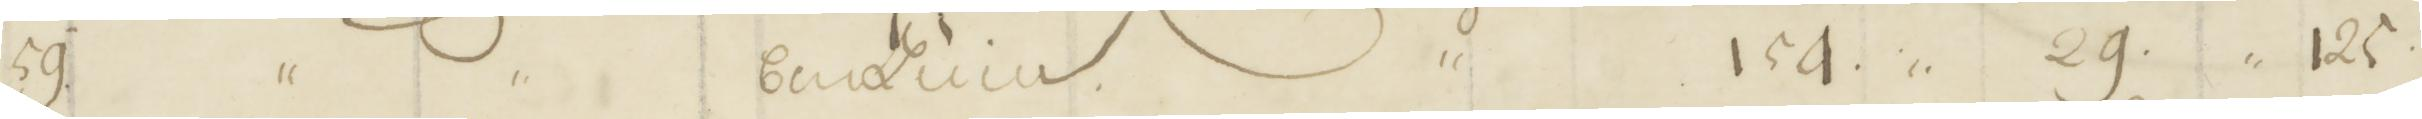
59. „ „ benzuin „ 154. „ 29. „ 125.
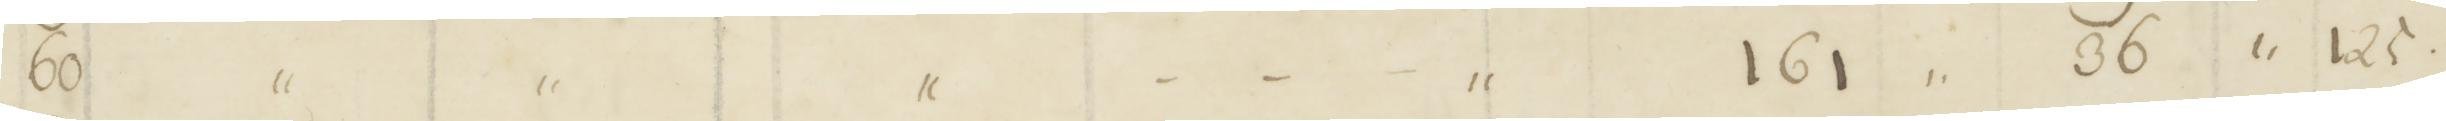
60 „ „ „ „ 161 „ 36 „ 125.
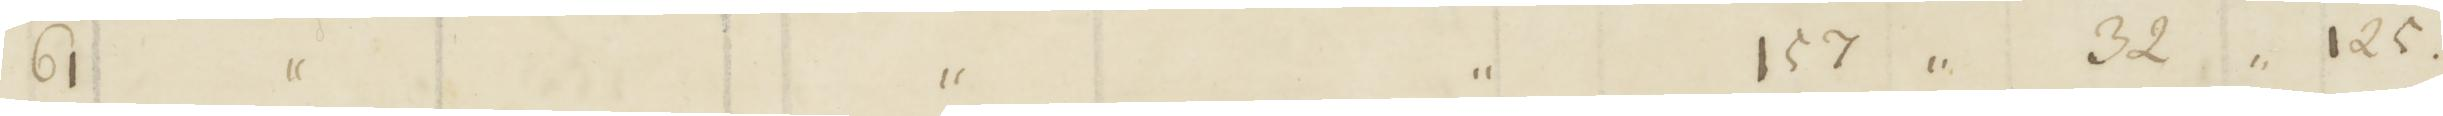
61 „ „ „ 157 „ 32 „ 125.
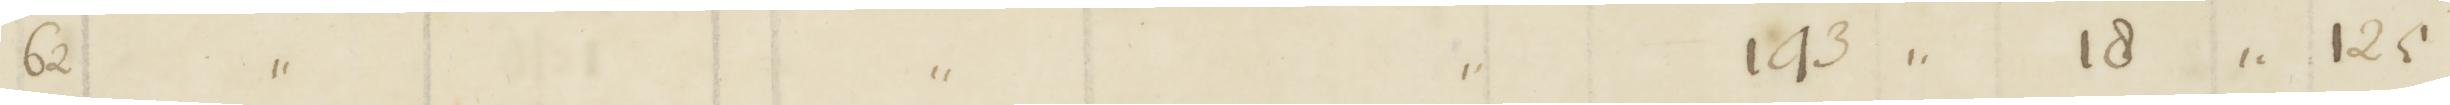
62 „ „ 143 „ 18 „ 125
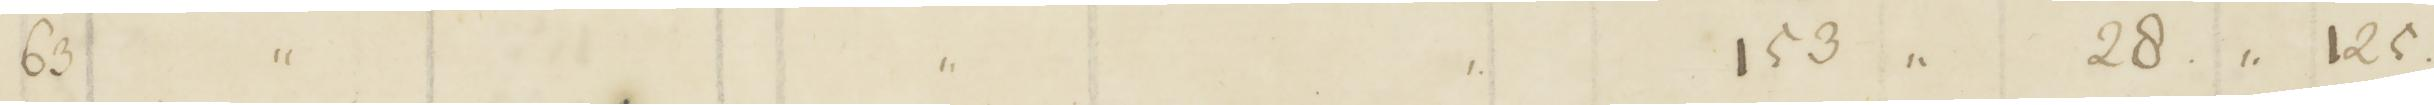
63 „ „ „ 153 „ 28 „ 125.
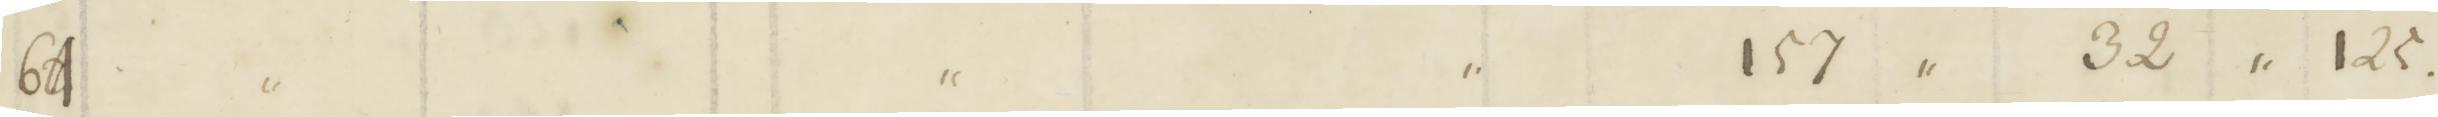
64 „ „ „ 157 „ 32 „ 125.
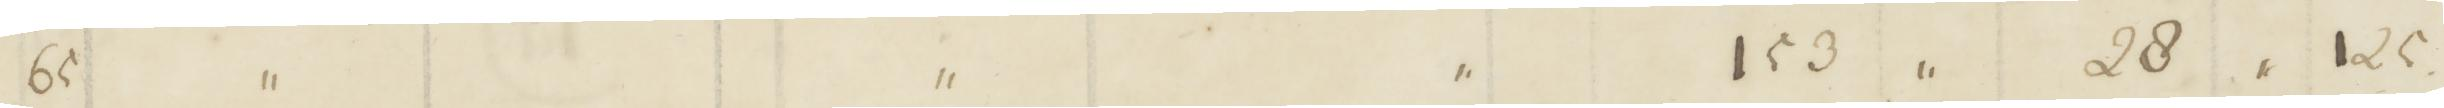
65 „ „ „ 153 „ 28 „ 125.
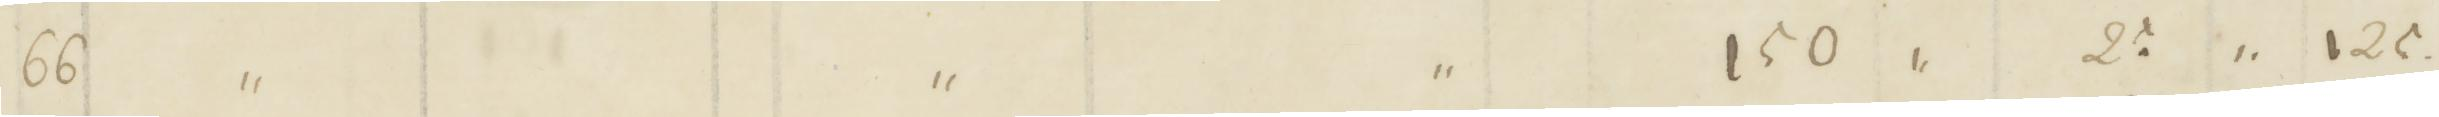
66 „ „ „ 150 „ 25 „ 125.
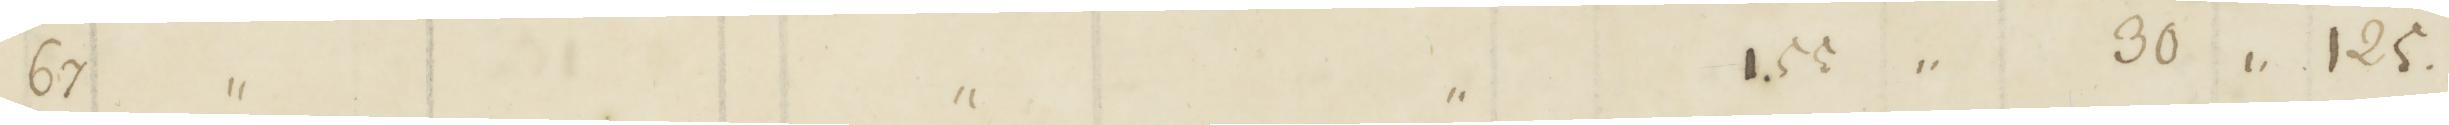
67 „ „ „ 155 „ 30 „ 125.
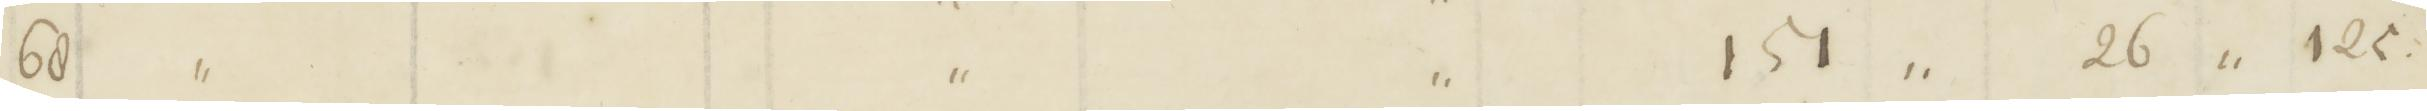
68 „ „ „ 151 „ 26 „ 125.
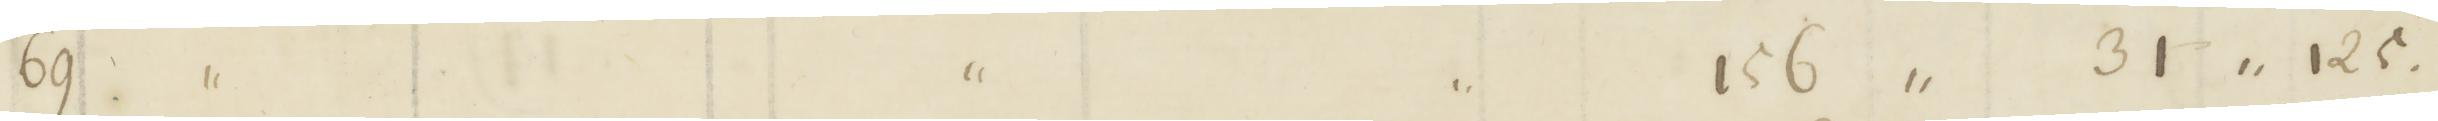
69 „ „ „ 156 „ 31 „ 125.
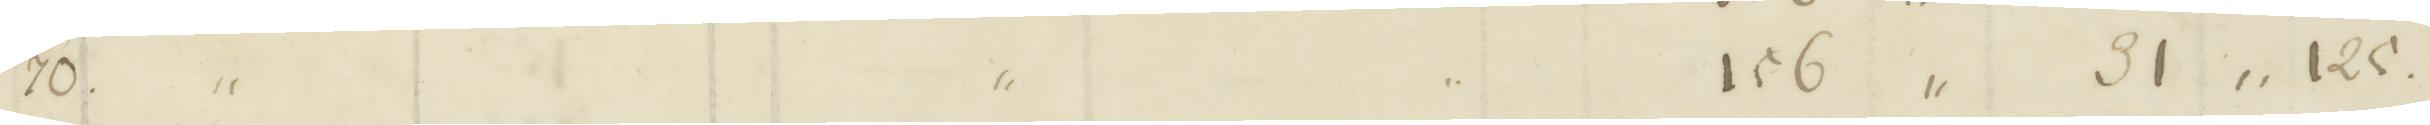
70. „ „ „ 156 „ 31 „ 125.
